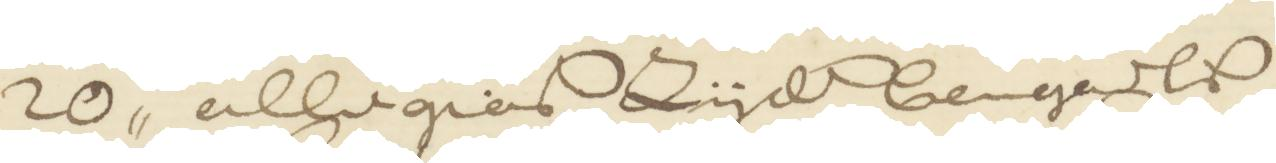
20: allegias Zijde bengaels
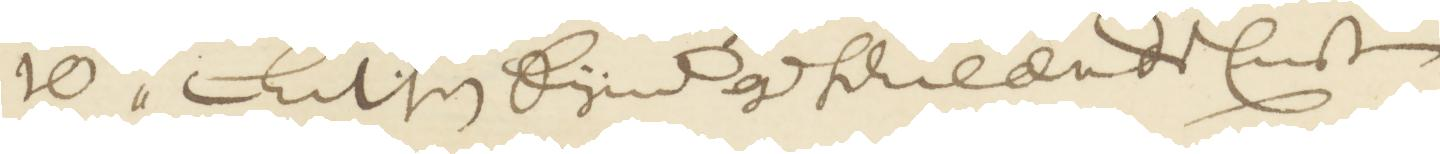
10 „ chitsen Fijne geschilderde Cust
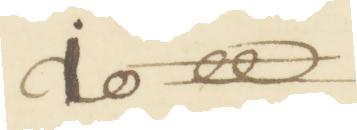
10 ll
